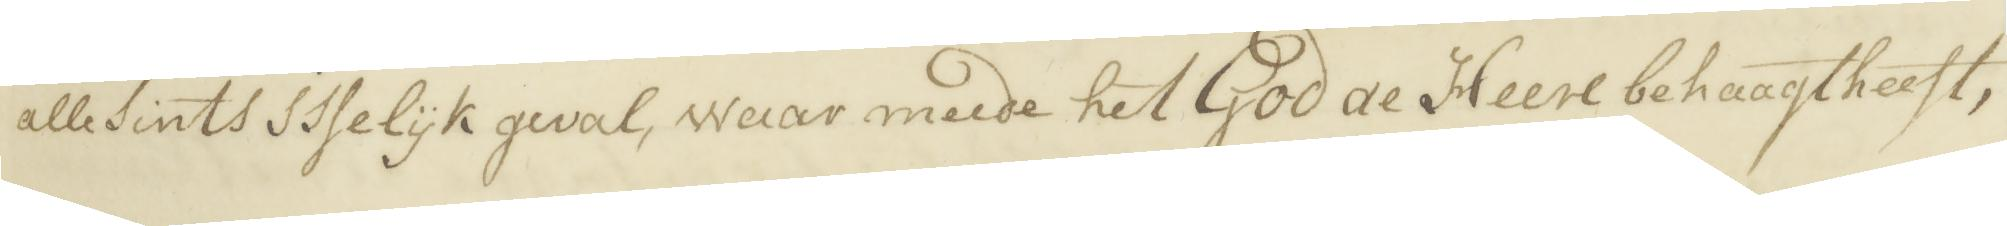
allesints iiselijk geval, waar meede het God de Heere behaagt heeft,
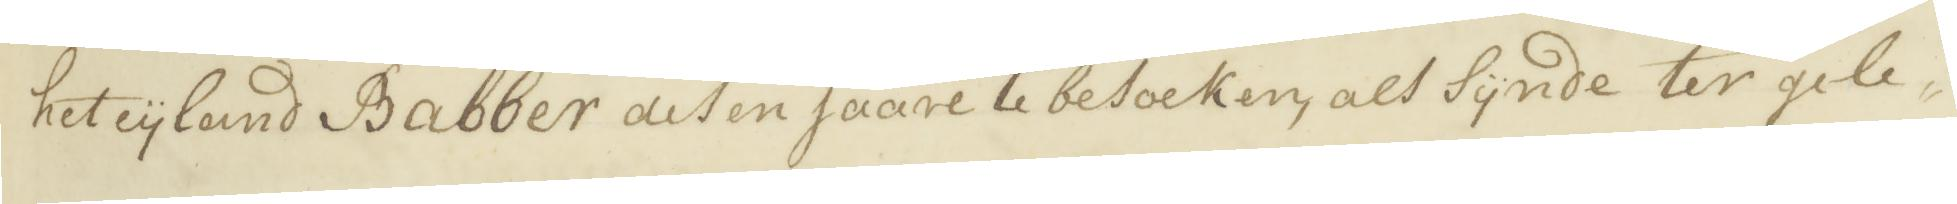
het eijland Babber desen jaare te besoeken, als sijnde ter gele„
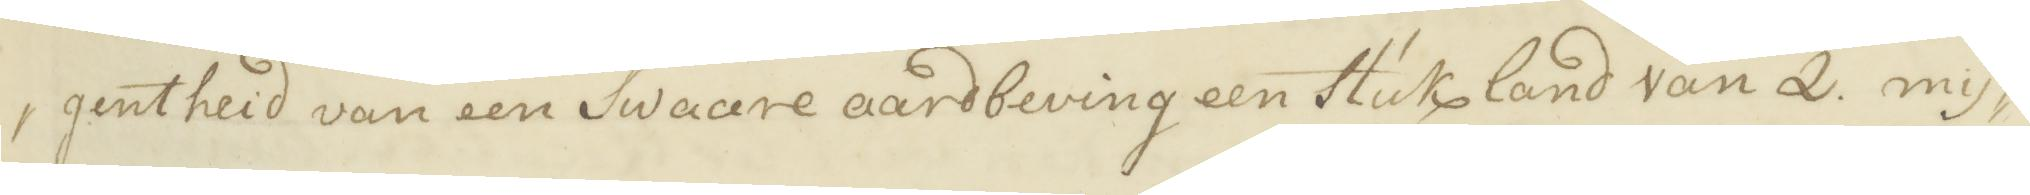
„gentheid van een swaare aardbeving een stuk land van 2. mij„
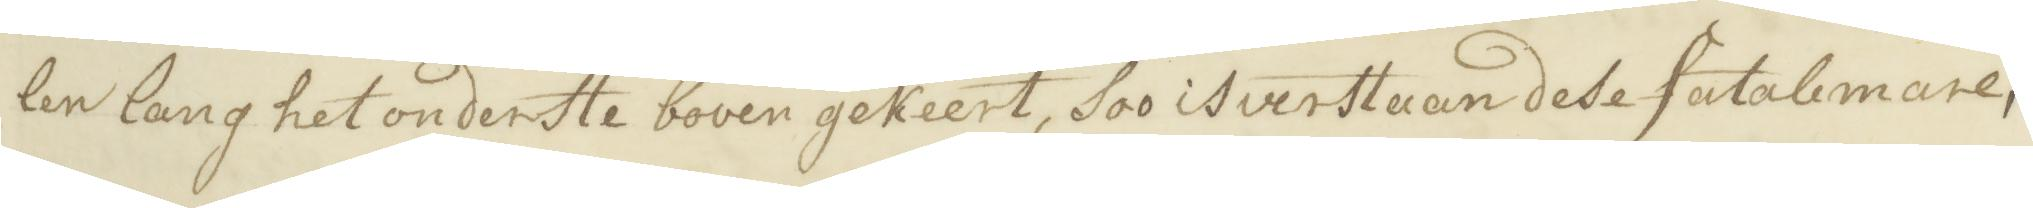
len lang het onderste boven gekeert, soo is verstaan dese fatale mare,
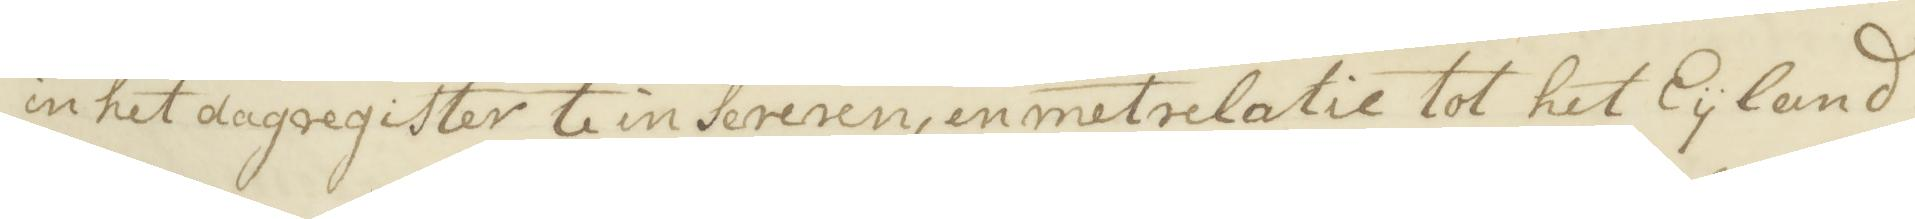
in het dagregister te insereren, en met relatie tot het Eijland
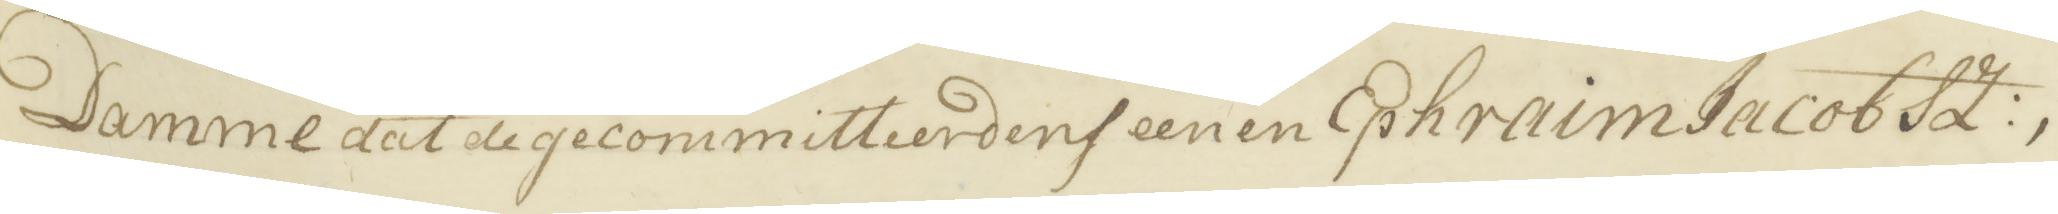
Damme dat de gecommitteerdens een en Ephraim Iacobsz:,
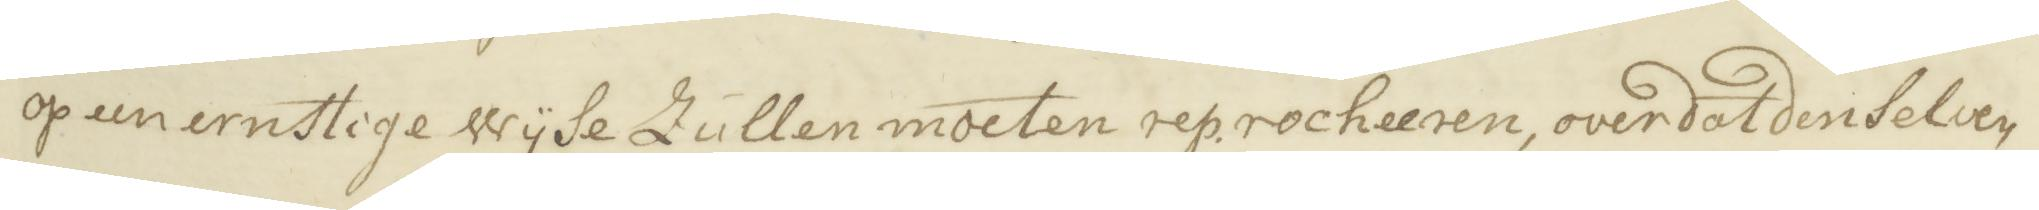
op een ernstige wijse zullen moeten reprocheeren, over dat denselven
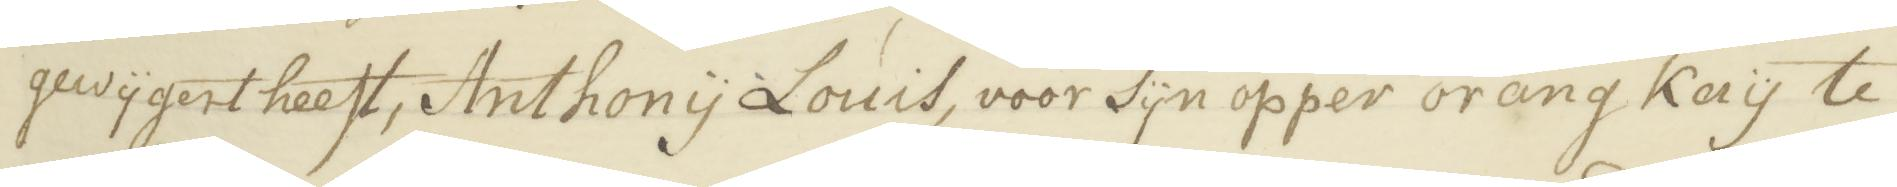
gewijgert heeft, Anthonij Louis, voor sijn opper orang kaij te
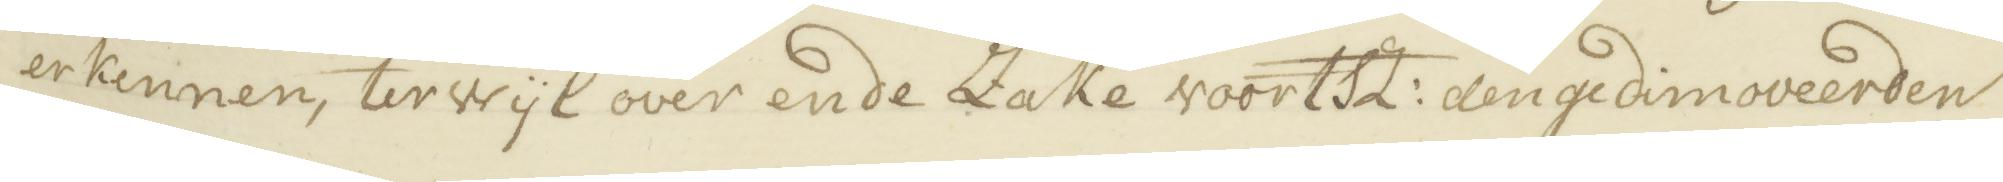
erkinnen, terwijl over ende zake voortsz: den gedimoveerden
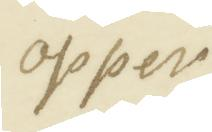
opper
